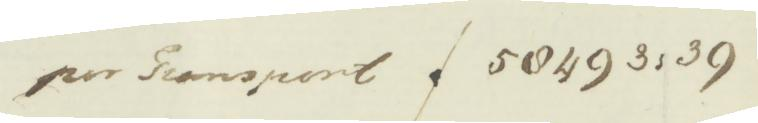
per Transport ƒ 58493:39
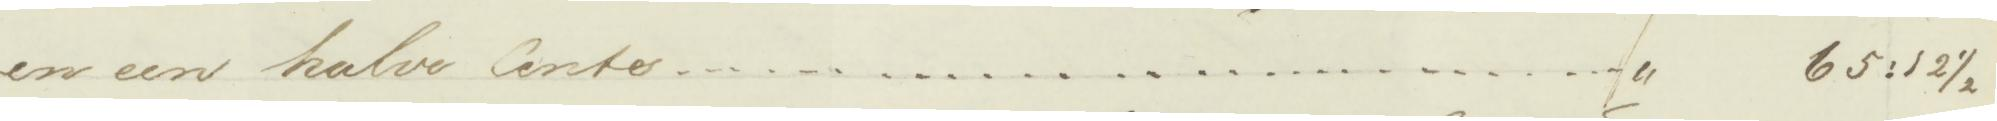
en een halve Cents . . . . - . . - . . . . . . . . . . . . . . . . . . . . „ 65:12½
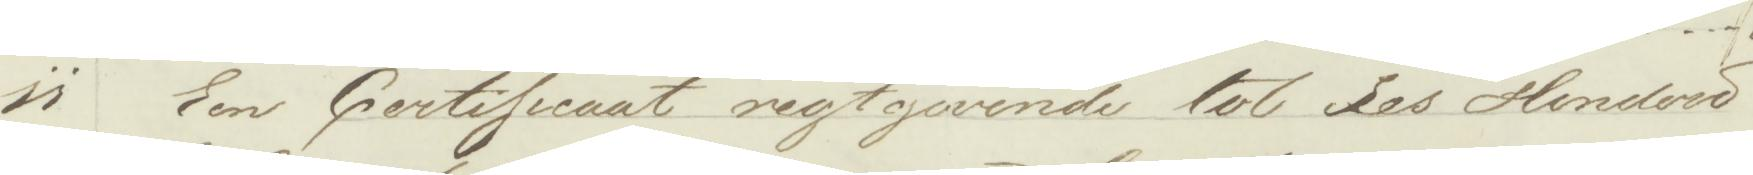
11 Een Certificaat regtgevende tot zes Honderd
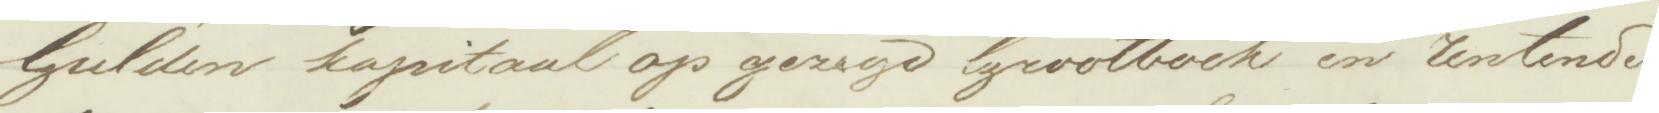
Gulden kapitaal op gezegd Grootboek en rentende
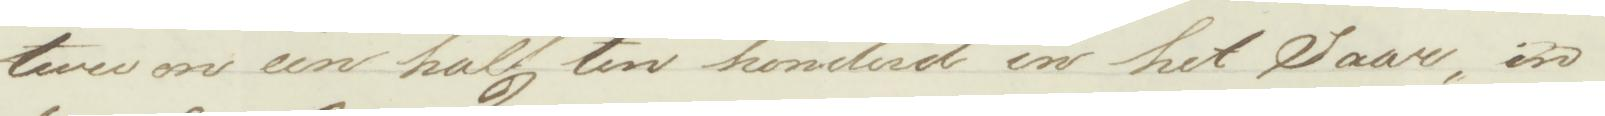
twee on een half ten honderd in het Iaar, in
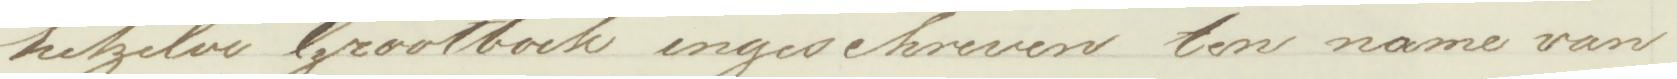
hetzelve Grootboek ingeschreven ten name van
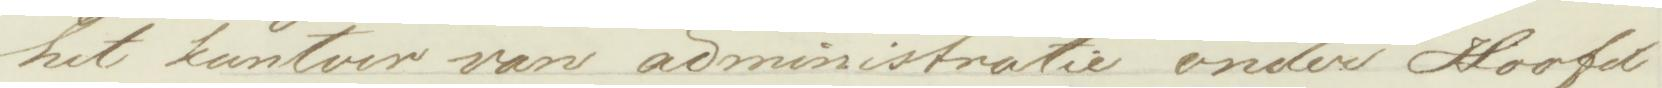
het kantoor van administratie onder Hoofd
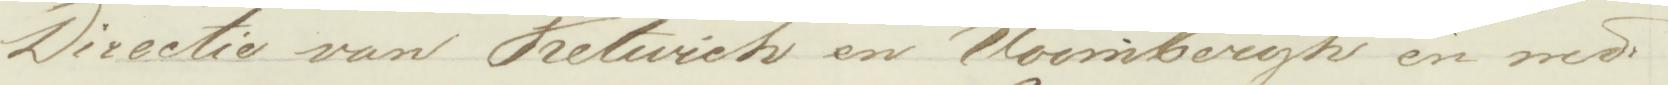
Directie van Ketwich en Voombergh en wed:
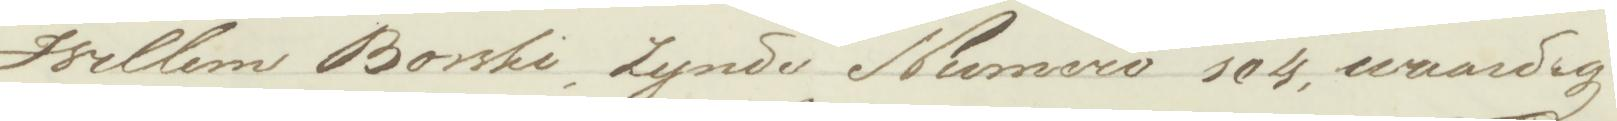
Willem Borski, zynde Numero 104, waardig
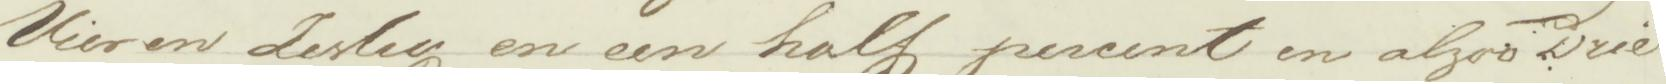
Vier en zestig en een half percent en alzoo Drie
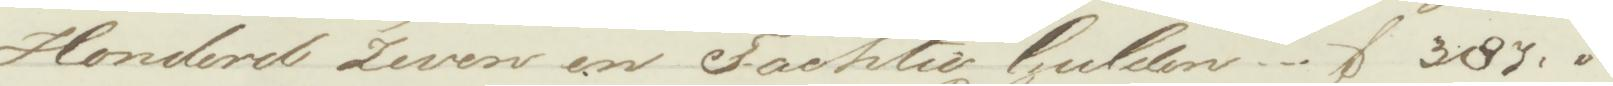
Honderd zeven en Tachtig Gulden - - - ƒ 387: „
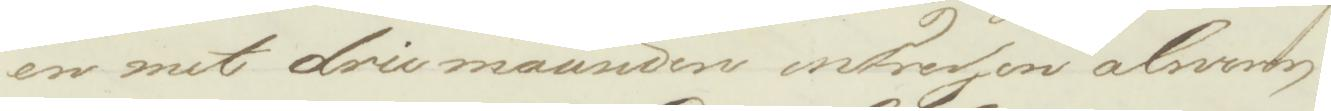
en met drie maanden intressen alsvoren
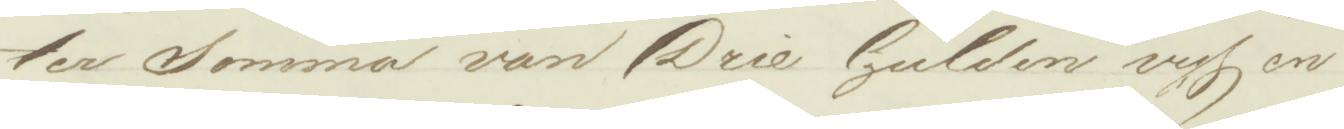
ter Somma van Drie Gulden vyf en
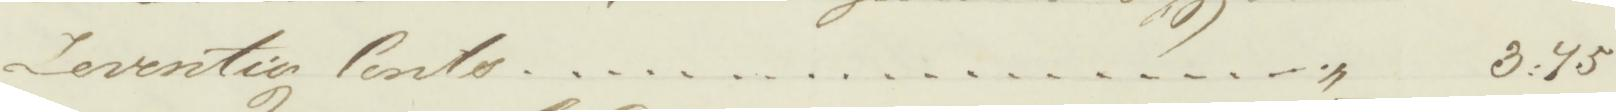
zeventig Cents . . . . . . . . . . . . . . . . . . . . . „ 3:75
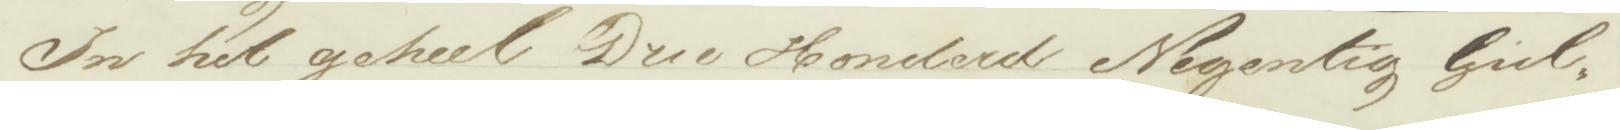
In het geheel Drie Honderd Negentig Gul„
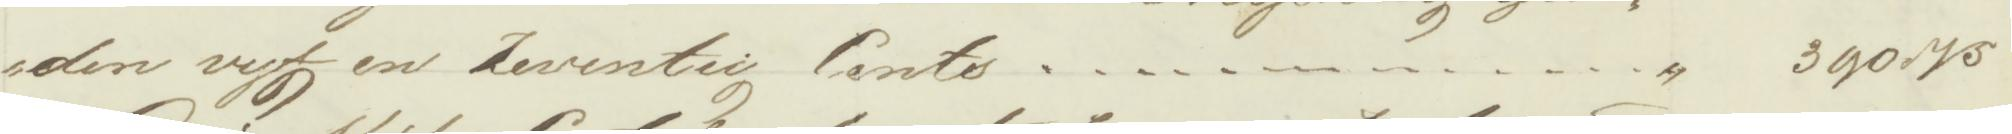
„den vyf en zeventig Cents . . . . . . . . . . . . . . . „ 390:75
